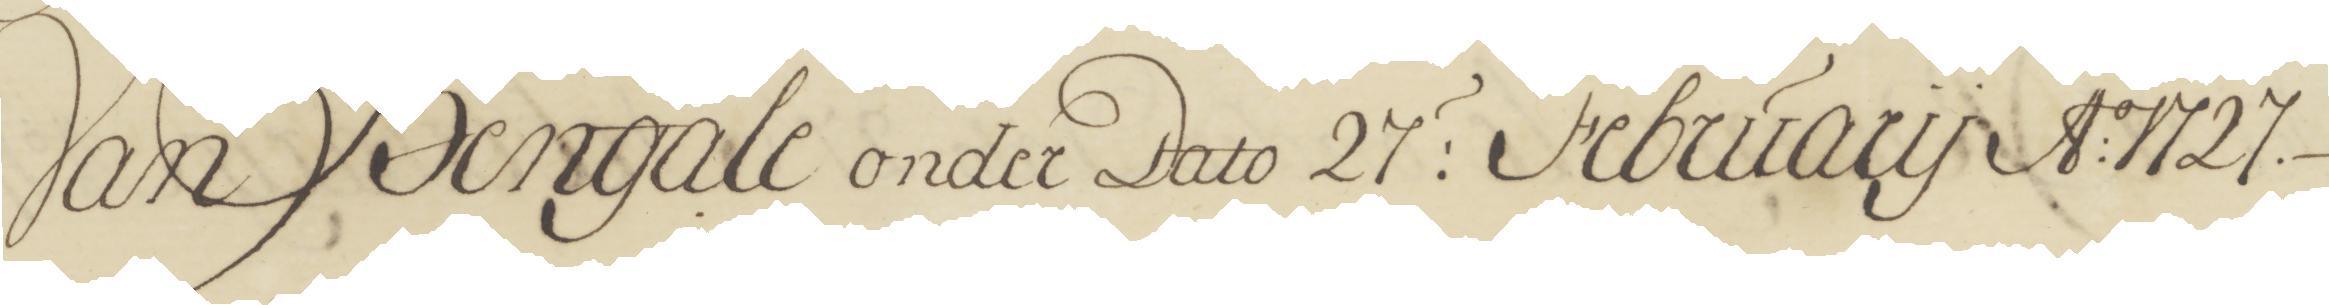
Van Bengale onder Dato 27:' Februarij A:o 1727. —
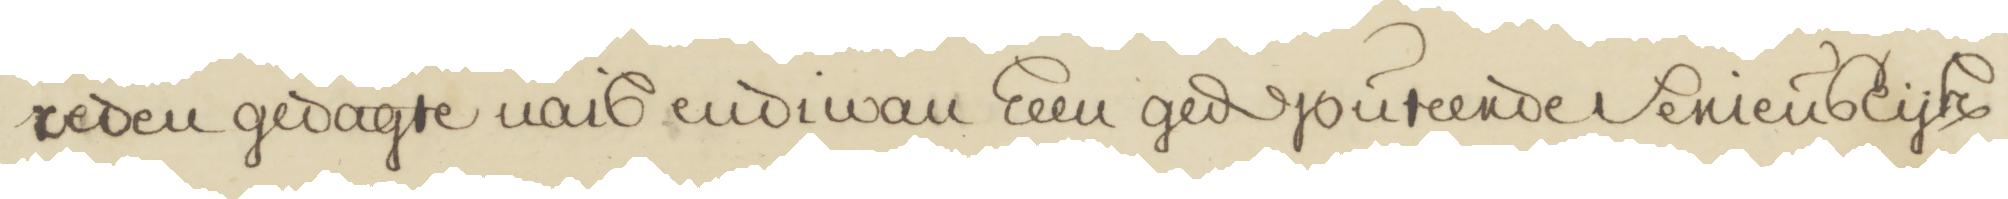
reden gedagte nais endiwan heen gedeputeerde Serieuslijk
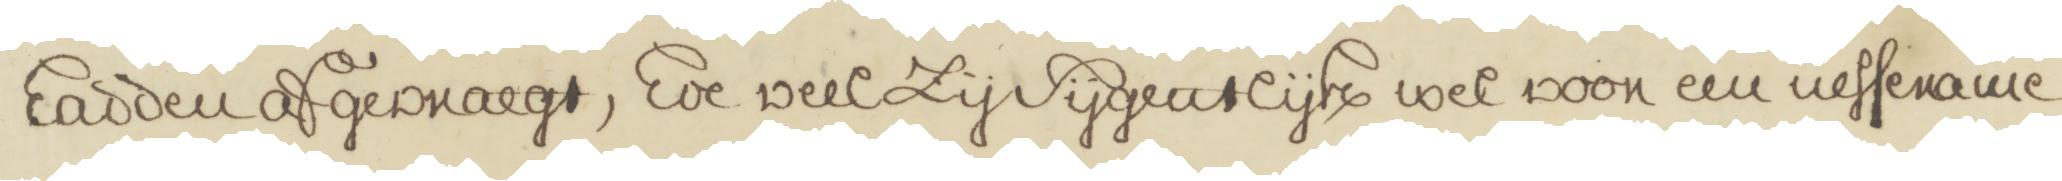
hadden afgevraegt, hoe veel zij Eijgentlijk wel voor een nesserarie
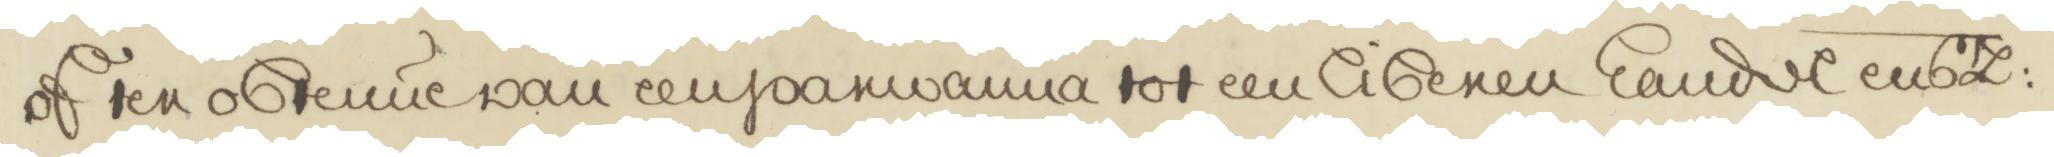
of ter obtenue van een parwanna tot een liberen handel ensz:
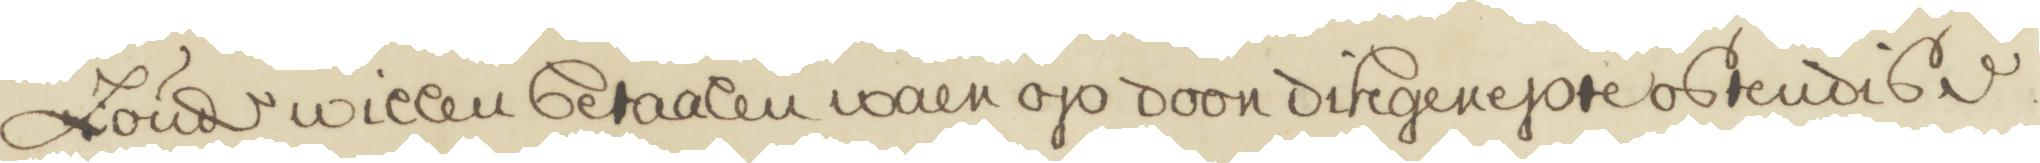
zoude willen betaalen waer op door dikgerepte ostendise
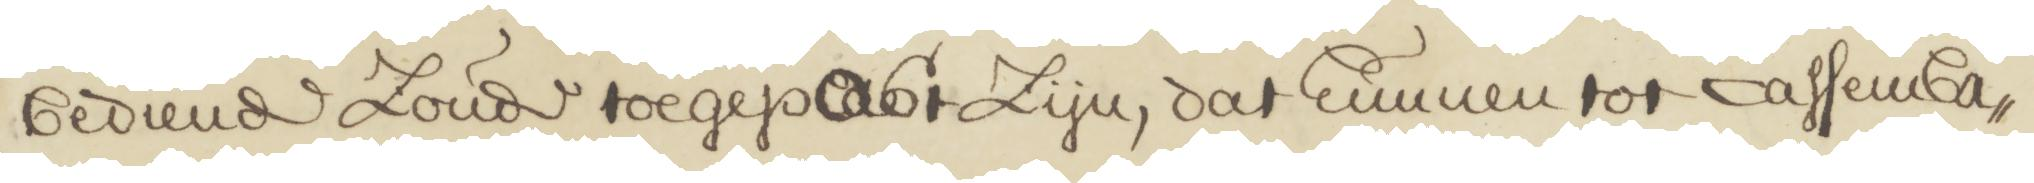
bediende zoude toegepast zijn, dat hunnen tot cassemba„
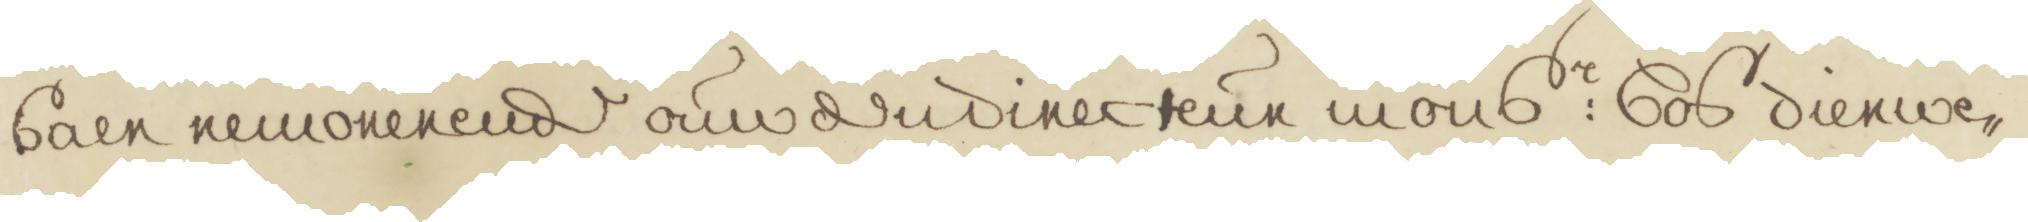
baer remorerende ouwden directeur in ons:r bos dierwe„
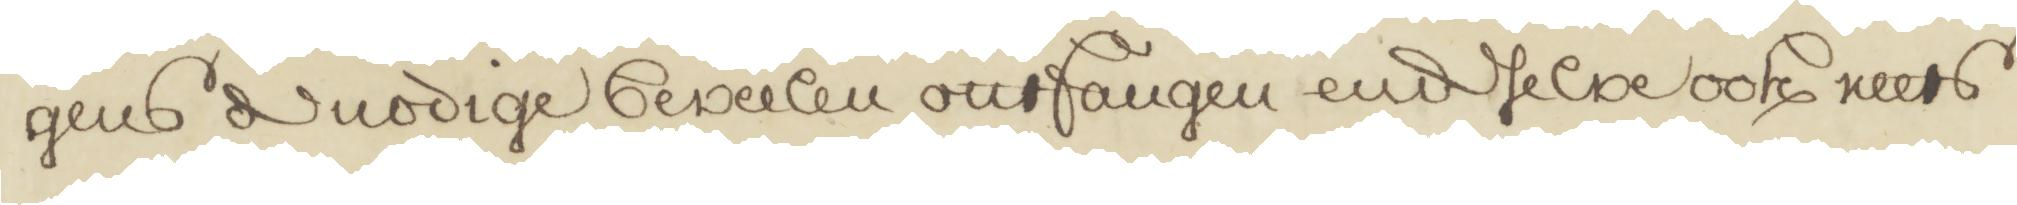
gens de nodige beveelen ontfangen en deselve ook reets
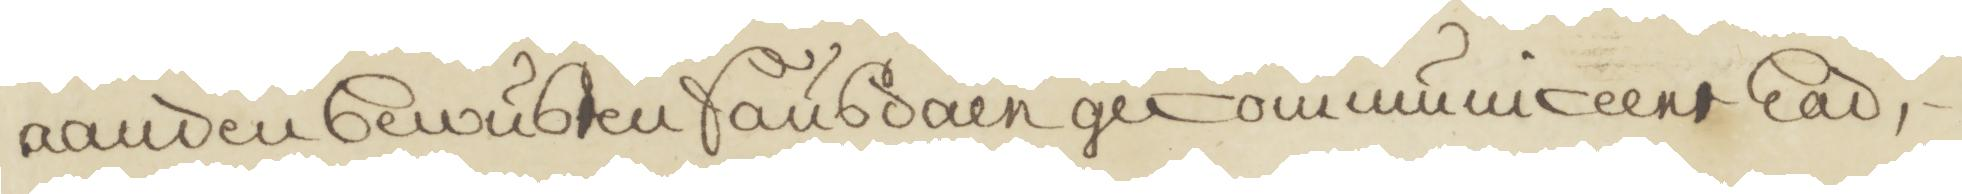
aan den bewusten fausdaer gecommuniceert had, —
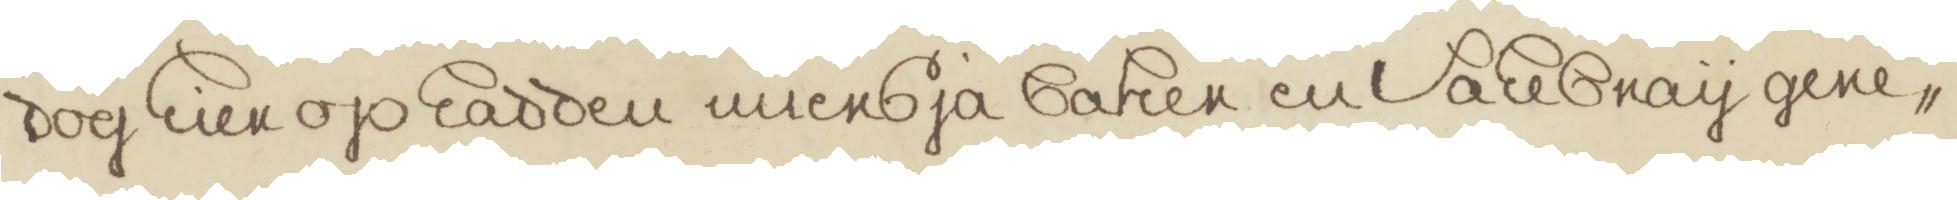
dog hier op hadden miersja baker en Sahebraij gere„
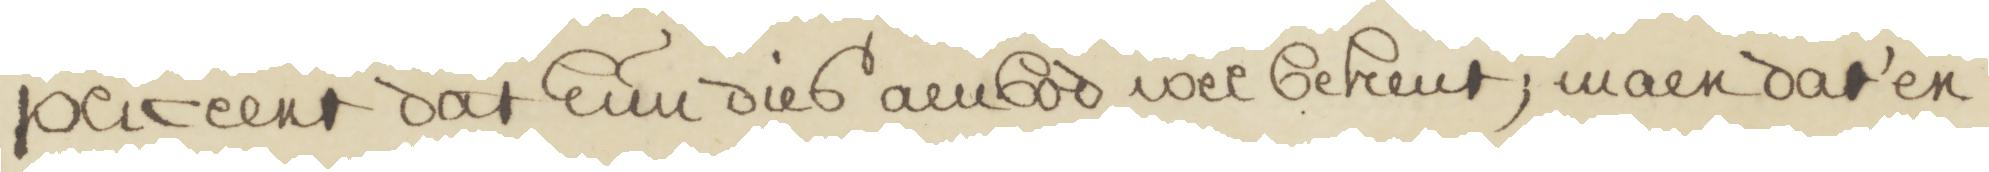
pliceert dat hun dies aenbod wel bekent; maer dat 'er
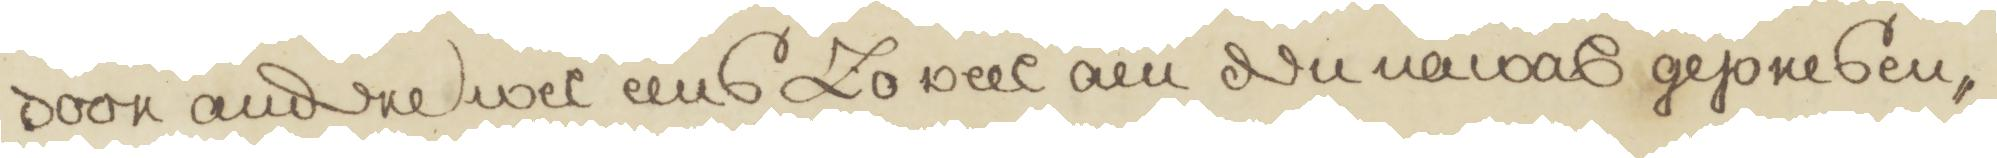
door andere wel eens zo veel aen den nawas gepresen„
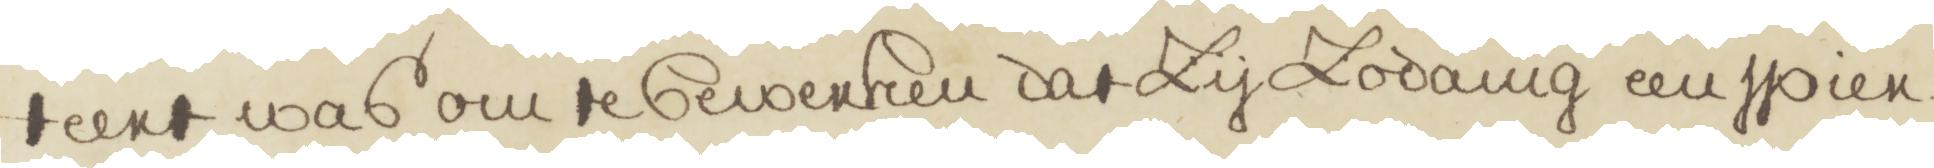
teert was om te bewerken dat zij zodanig een ppier
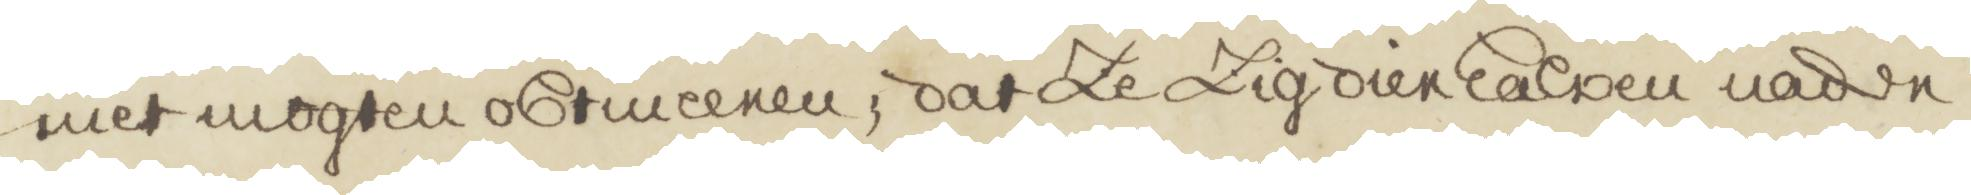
niet mogten obtineeren; dat ze zig dierhalven nader
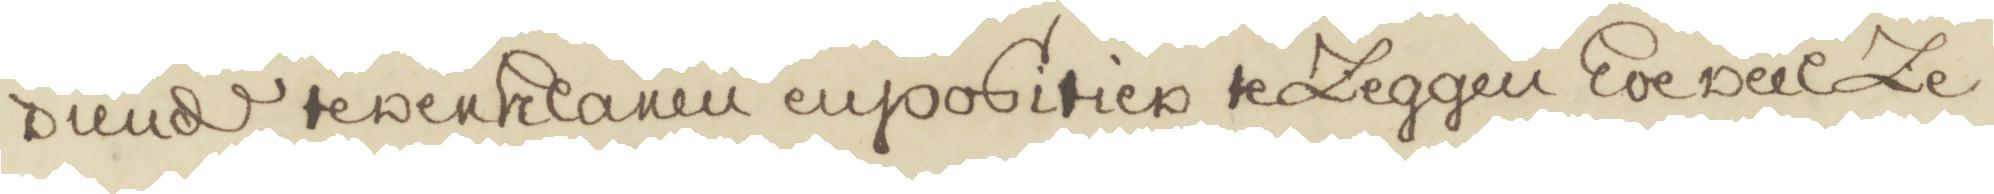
diende te verklaren en positiev te zeggen hoe veel ze
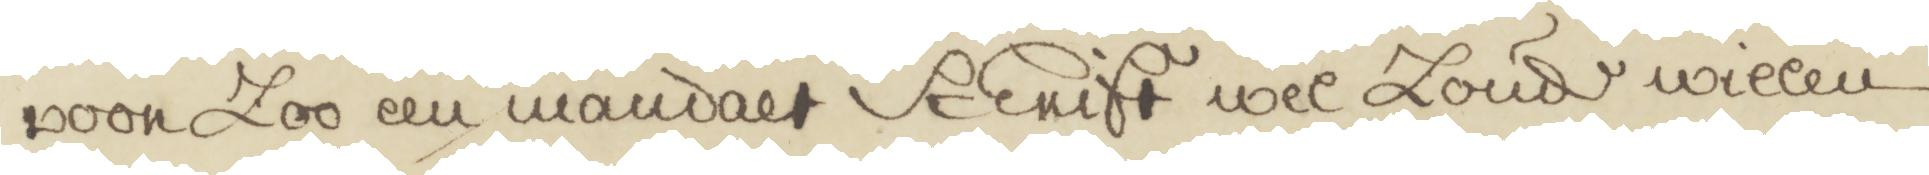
voor zoo een mandaet schrift wel zoude willen
